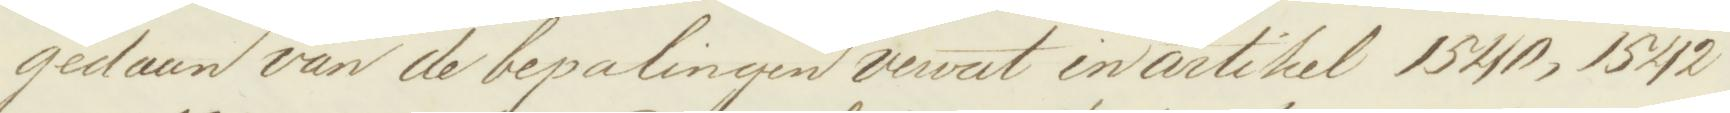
gedaan van de bepalingen vervat in artikel 1540, 1542
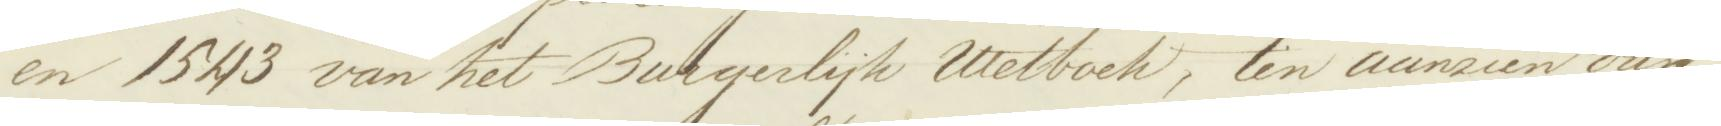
en 1543 van het Burgerlijk Wetboek, ten aanzien van
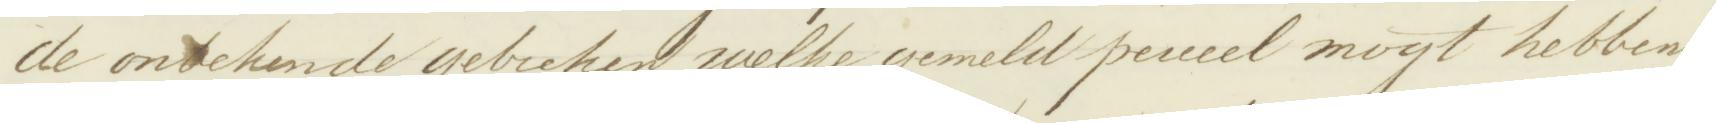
de onbekende gebreken welke gemeld perceel mogt hebben
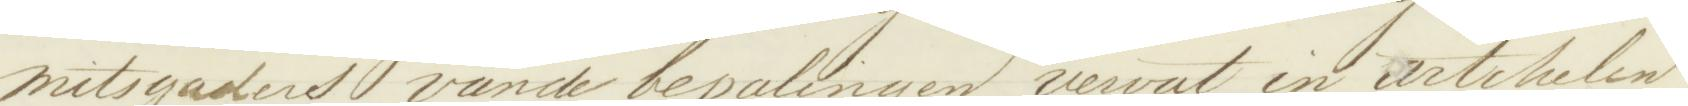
mitsgaders vande bepalingen vervat in artikelen
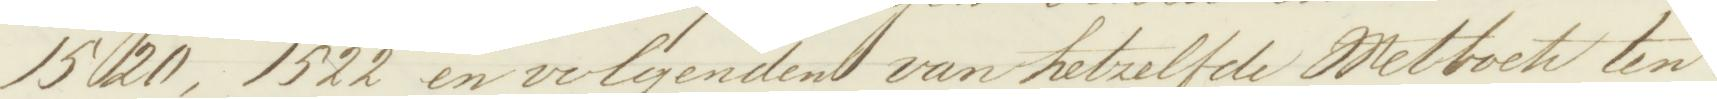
1520, 1522 en volgenden van hetzelfde Wetboek ten
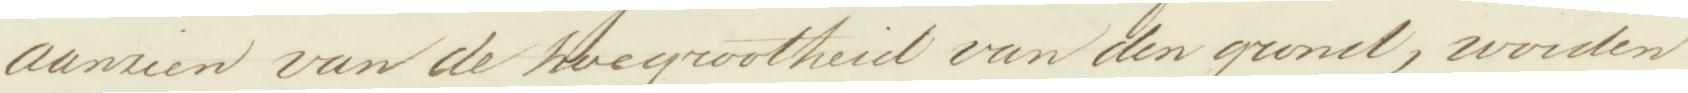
aanzien van de toegrootheid van den grond, worden
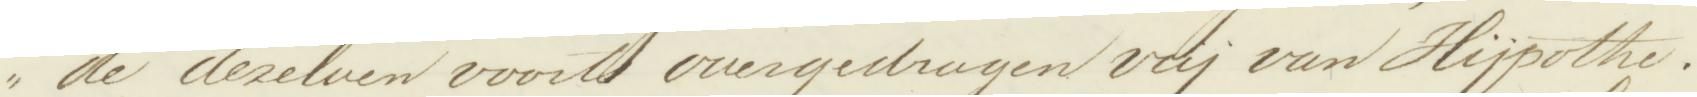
„de dezelven voorts overgedragen vrij van Hijpothe„
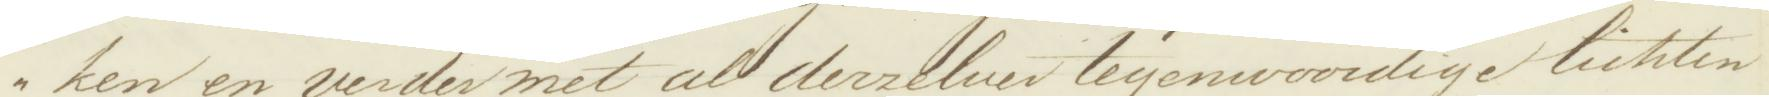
„ken en verder met al derzelver tegenwoordige lichten
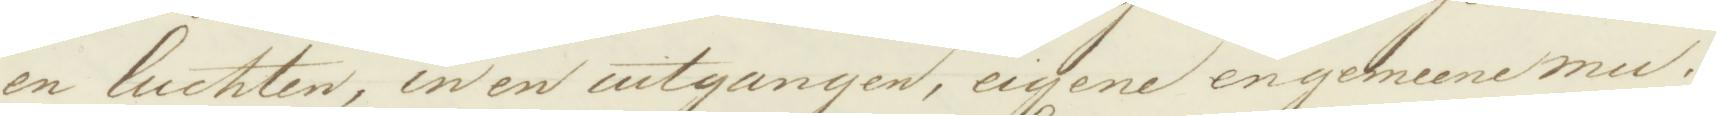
en luchten, in en uitgangen, eigene en gemeene mu„
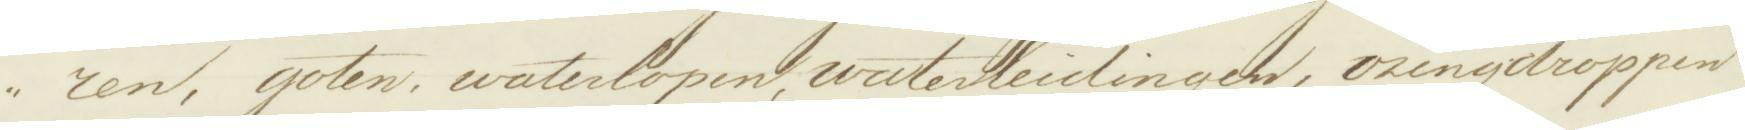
„ren, goten, waterlopen, waterleidingen, ozingdroppen
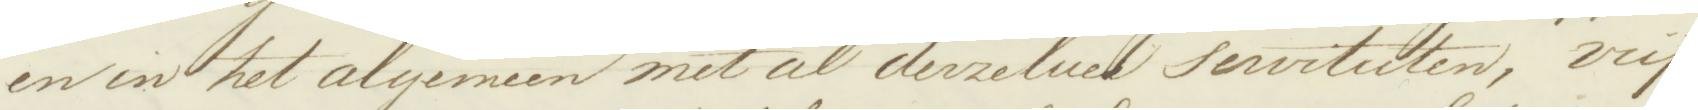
en in het algemeen met al derzelve servituten, vrij
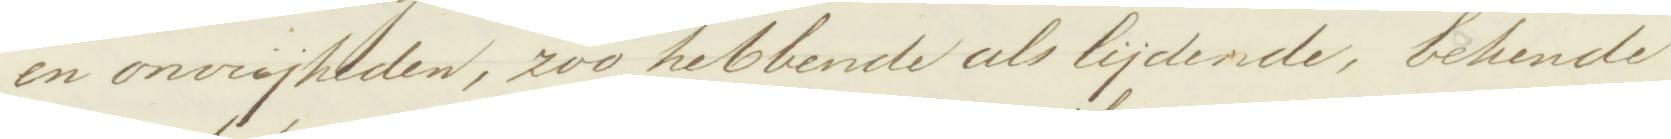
en onvrijheden, zoo hebbende als lijdende, bekende
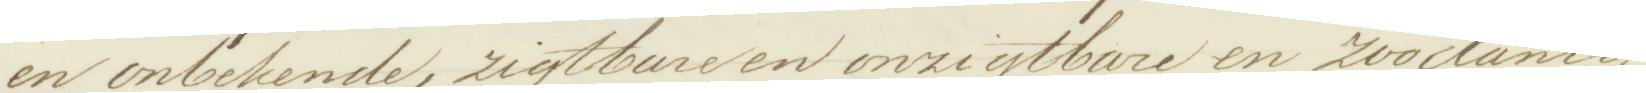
en onbekende, zigtbare en onzigtbare en zoodanig
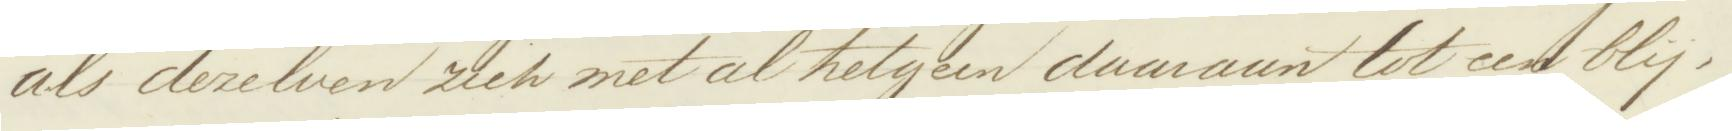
als dezelven zich met al hetgeen daaraan tot een blij„
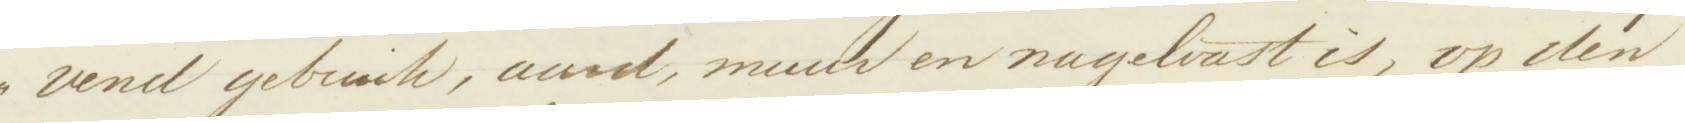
„vend gebruik, aard, muur en nagelvast is, op den
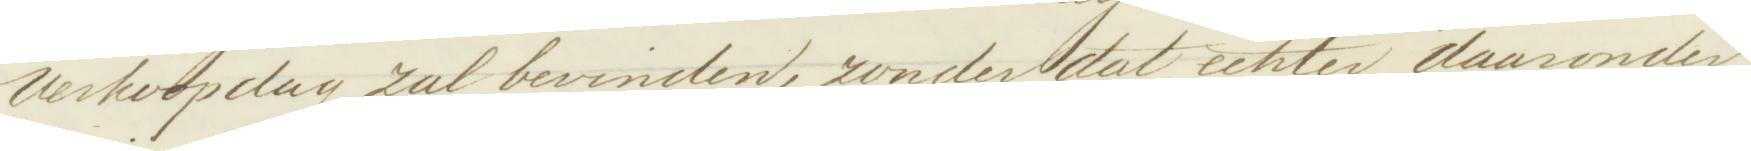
verkoopdag zal bevinden, zonder dat echter daaronder
